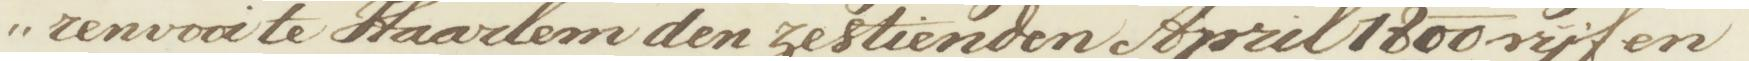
„ renvooi te Haarlem den zestien den April 1800 vijf en
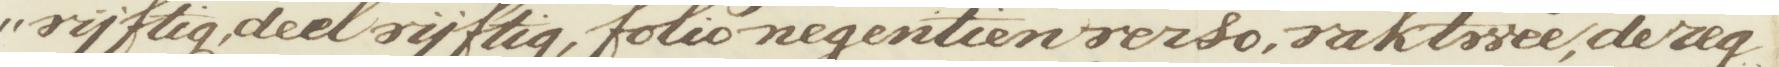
„ vijftig, deel vijftig, folio negentien verso, vak twee, de reg„
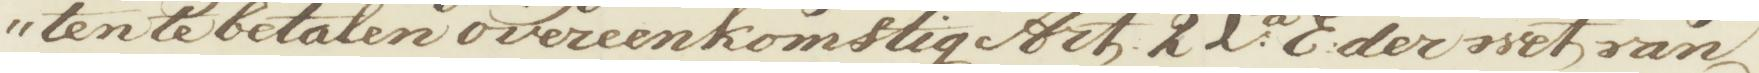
„ ten te betalen overeenkomstig Art. 2 L:a E: der wet van
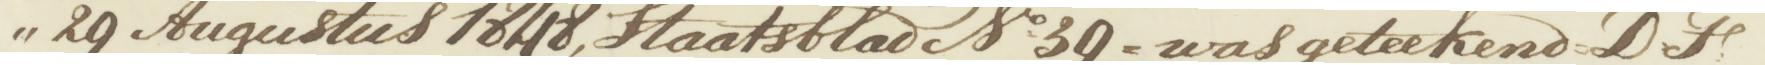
„ 29 Augustus 1848, Staatsblad N:o 39 = was geteekend = D. F:
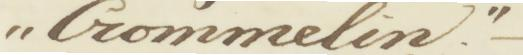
„ Crommelin."-
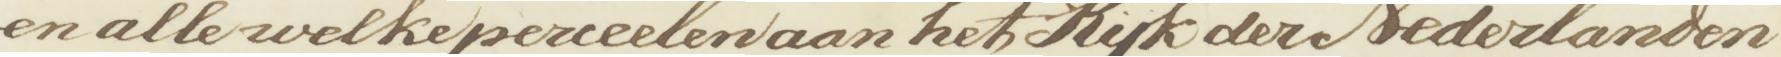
en alle welke perceelen aan het Rijk der Nederlanden
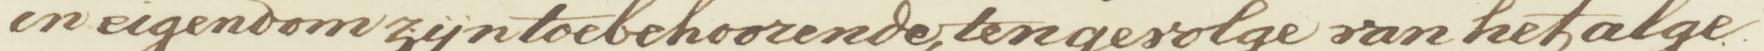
in eigendom zijn toebehoorende, ten gevolge van het alge„
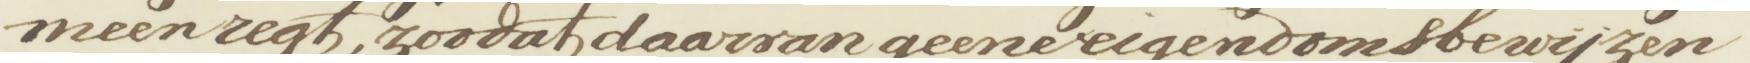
meen regt, zoo dat daarvan geene eigendomsbewijzen
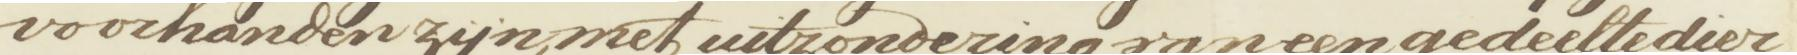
voorhanden zijn, met uitzondering van een gedeelte dier
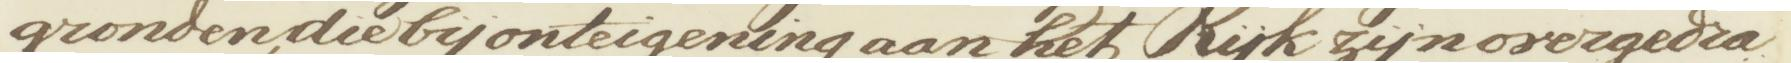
gronden, die bij onteigening aan het Rijk zijn overgedra„
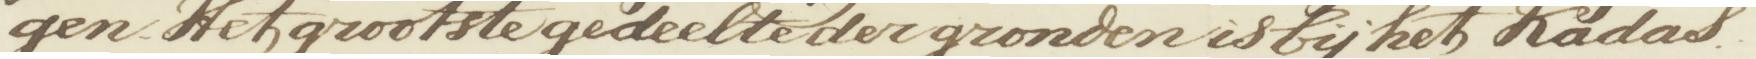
gen. Het grootste gedeelte der gronden is bij het Kadas„
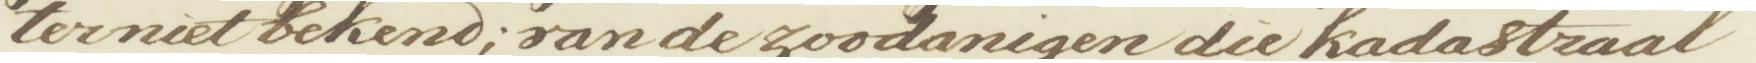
ter niet bekend; van de zoodanigen die kadastraal
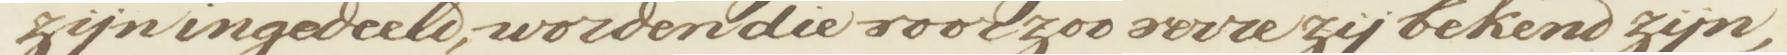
zijn ingedeeld, worden die voor zoo verre zij bekend zijn
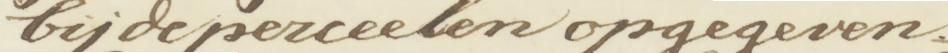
bij de perceelen opgegeven.
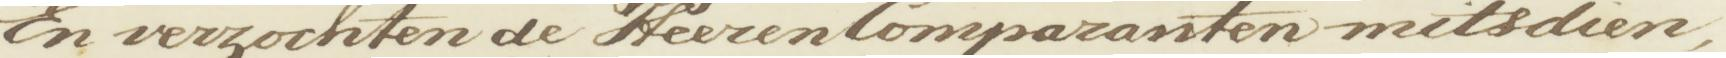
En verzochten de Heeren Comparanten mitsdien
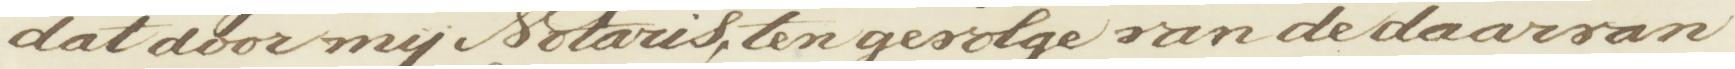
dat door mij Notaris, ten gevolge van de daarvan
